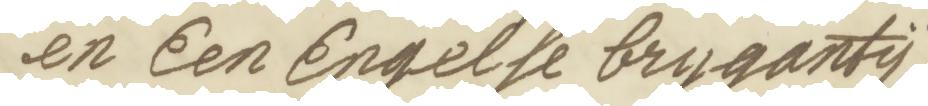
en Een Engelse brygantij
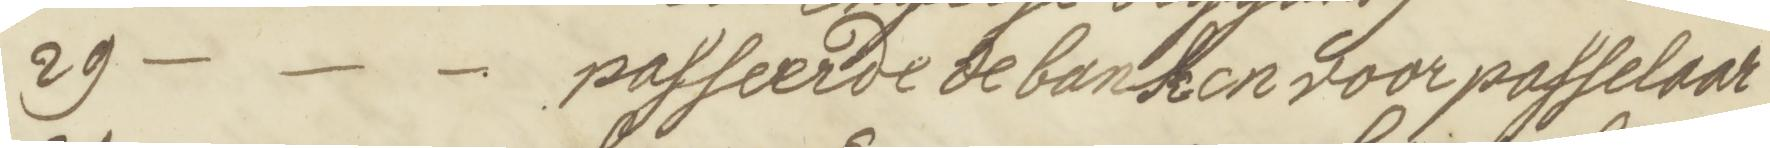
29 — — — passeerde de banken voor passelaar
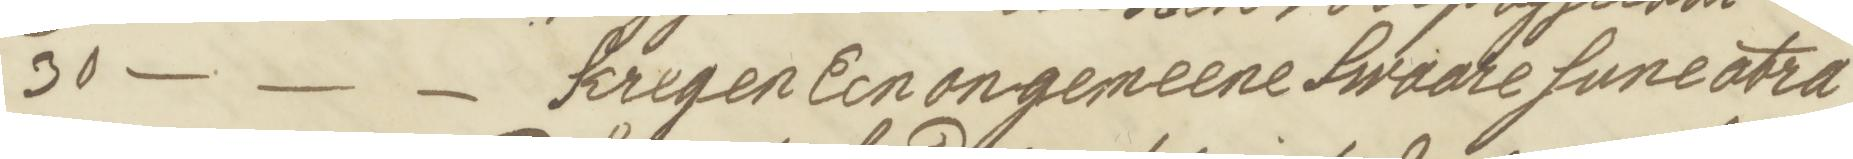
30 — — — kregen Een ongemeene swaare sune atra
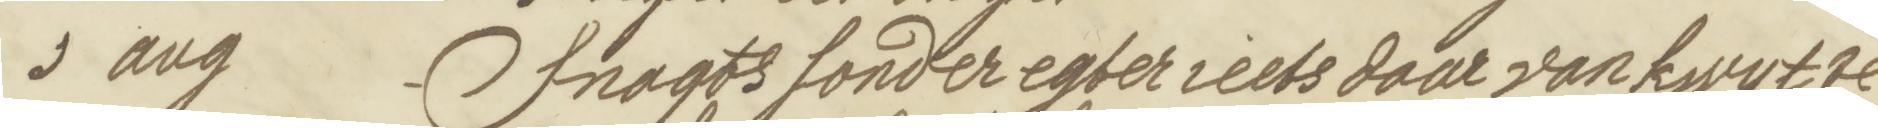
1 aug - Snagts sonder egter ieets door van kwyt te
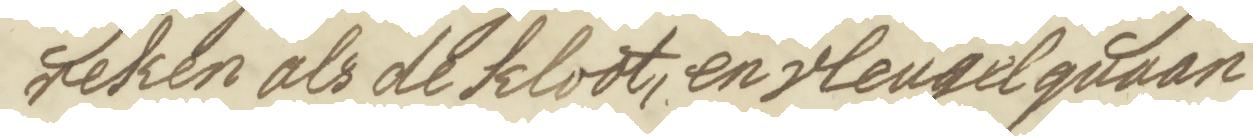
reken als de kloot, en vlengel qraan
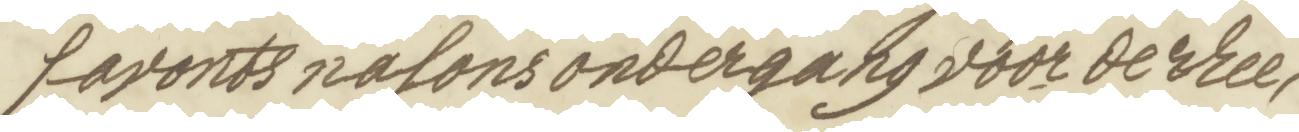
savonts nasons ondergang voor de rhee,
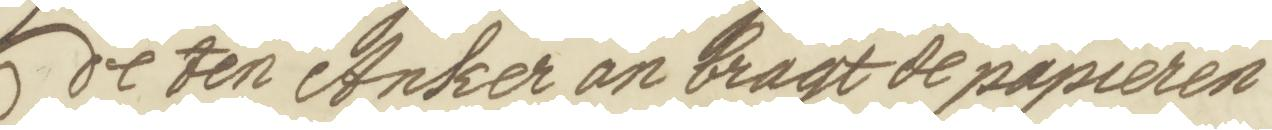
de ten Anker an bragt de papieren
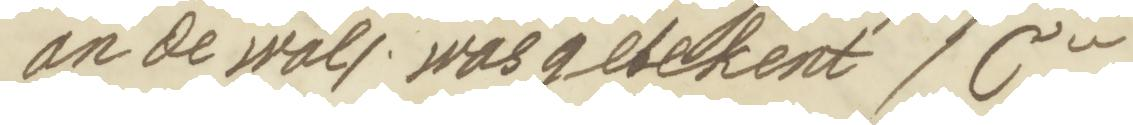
an de wal /. was getekent / Cn
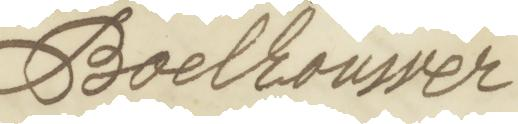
Boelhouwer
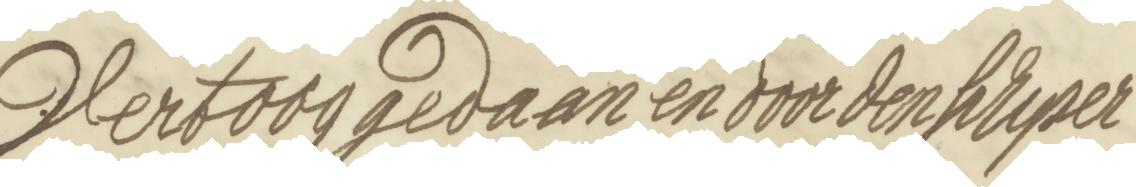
Vertoog gedaan en door den schiper
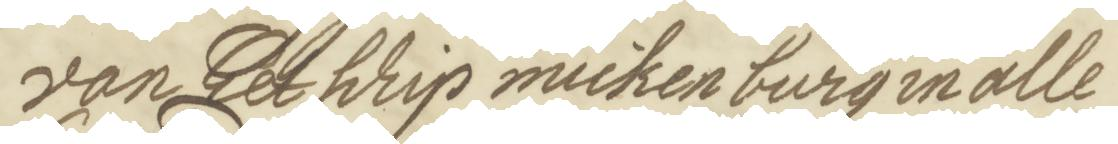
van het schip micken burg in alle
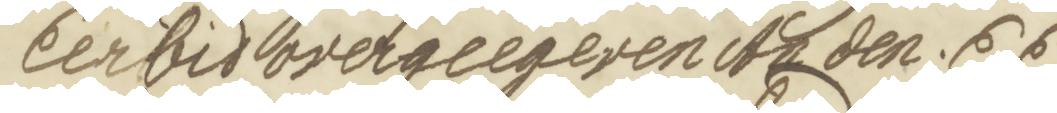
Eerbid overgeegeven An den. E. E
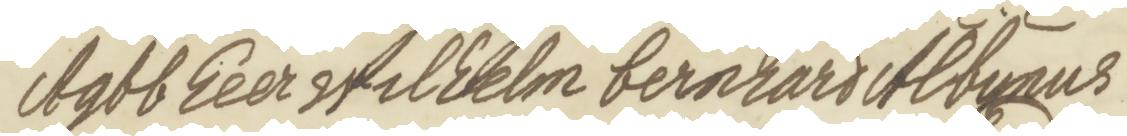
Agtb heer wilhelm bernhard Albynus
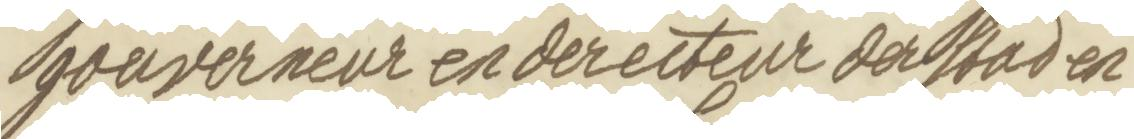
gouverneur en derecteur der stad en
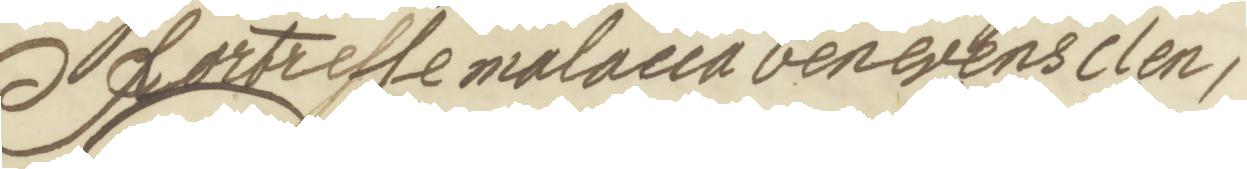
fortresse malacca benevens den,
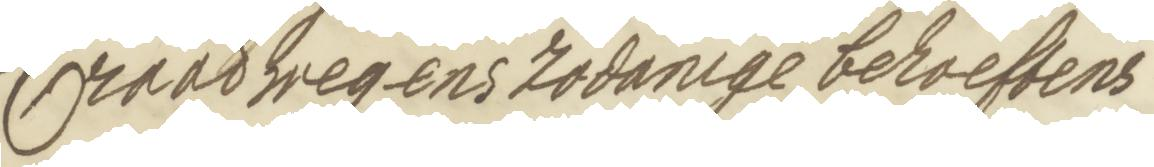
raad wegens zodanige behoeftens
